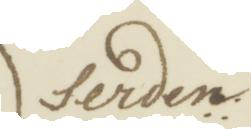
serden
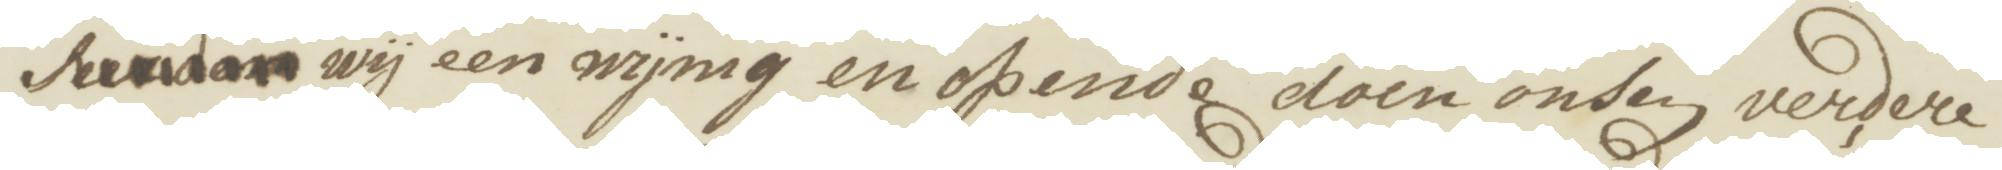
seerden wij een wijnig en opende doen onsen verdere
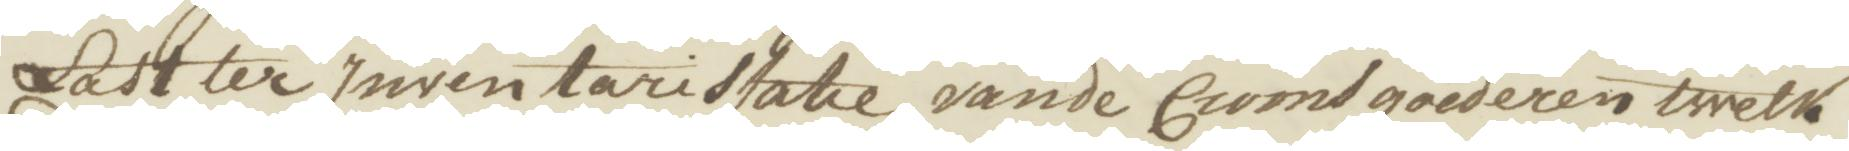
Last ter Jnventaristatie vande Croons goederen 'twelk
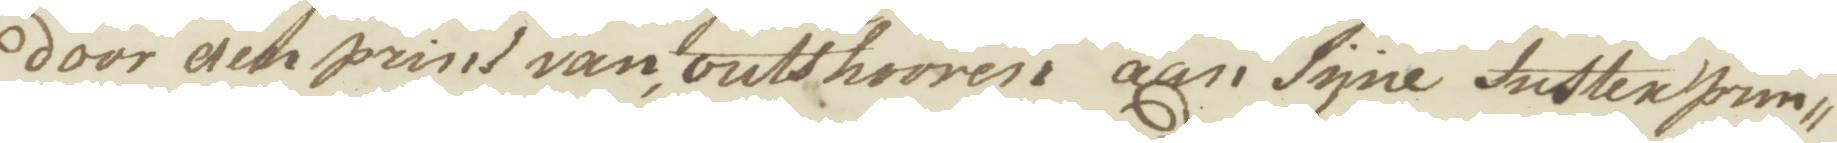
door den prins van outshooren aan sijne suster prin„
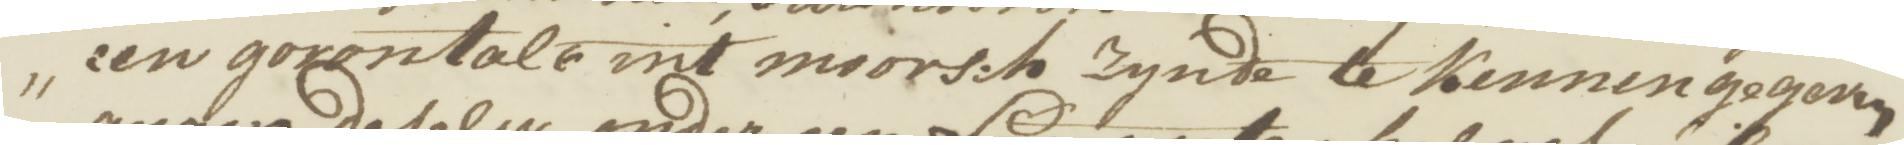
„ cen gorontale in't moorsch zijnde te kennen gegeven
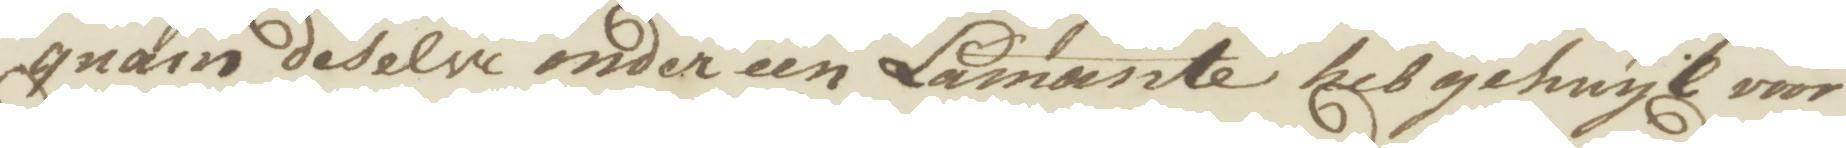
quam deselve onder een Lamante heb gehuijl voor
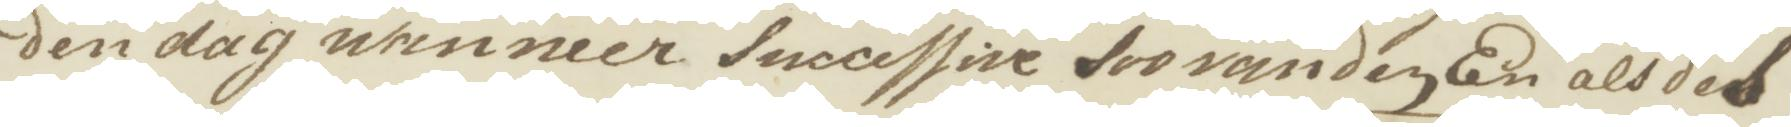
den dag wanneer successive soo van den Een als des
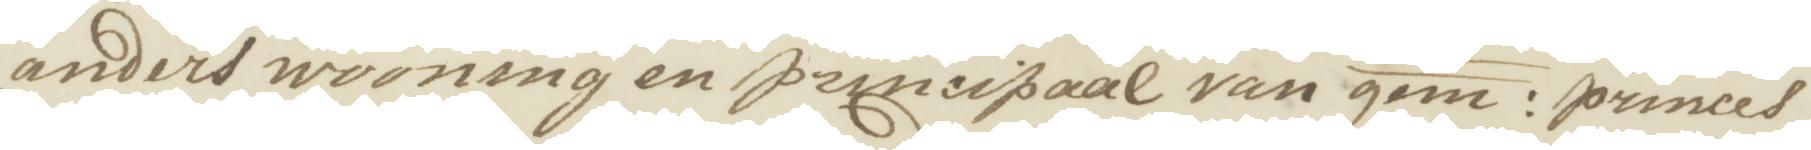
anders wooning en principaal van gem: princes
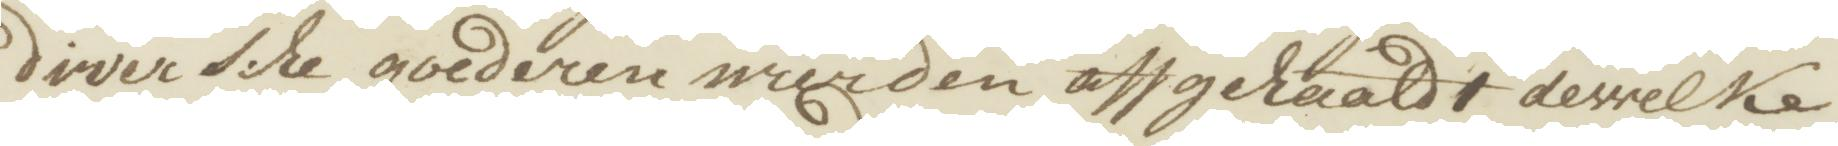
diversche goederen wierden affgehaaldt dewelke
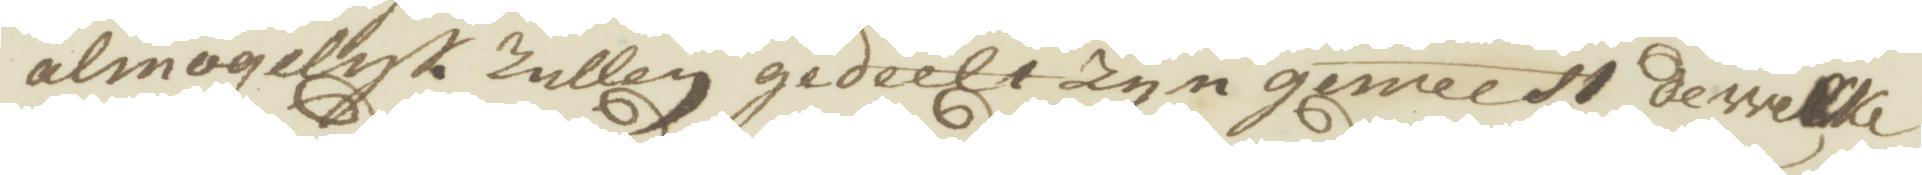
almogelyk zullen gedeelt zyn geweest de welke
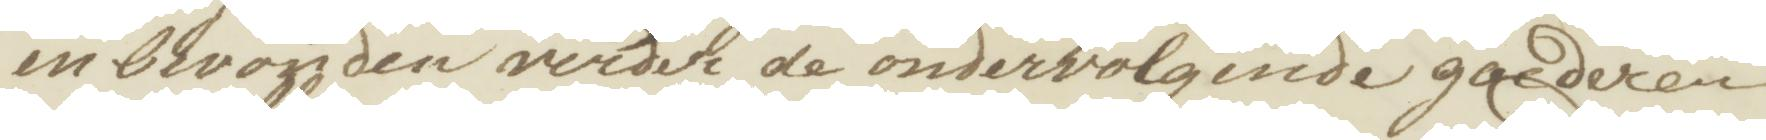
en bevonden verder de ondervolgende goederen
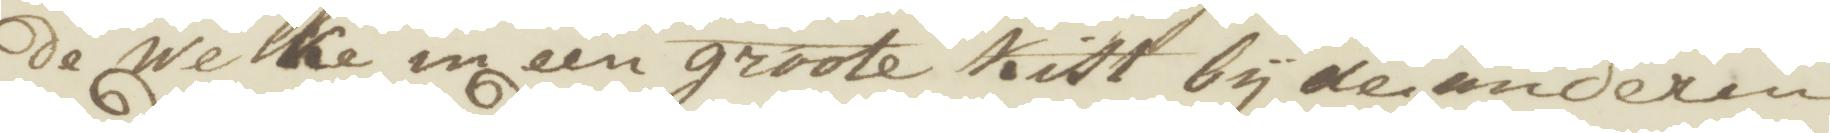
de welke in een groote kist bij de anderen
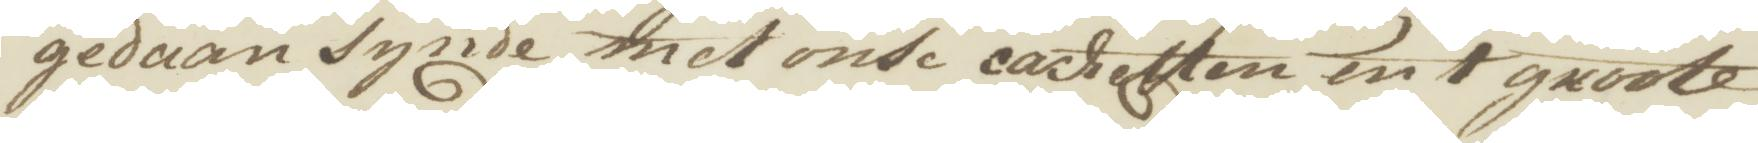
gedaan synde met onse cachetten en ’t groote
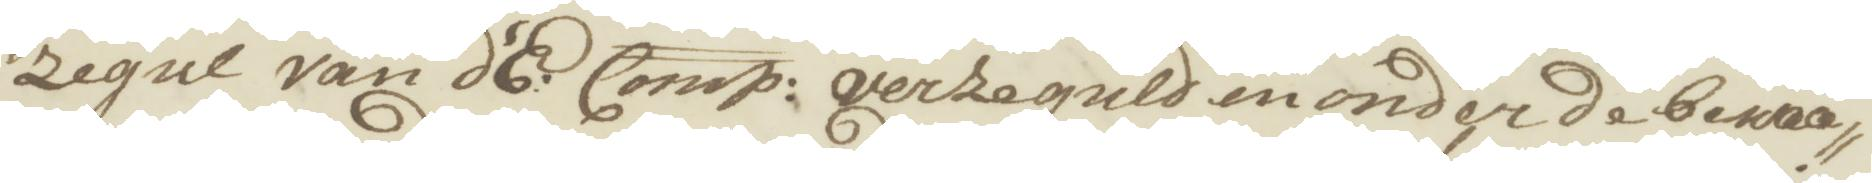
zegul van d'E: Comp: verzeguld en onder de bewaa„
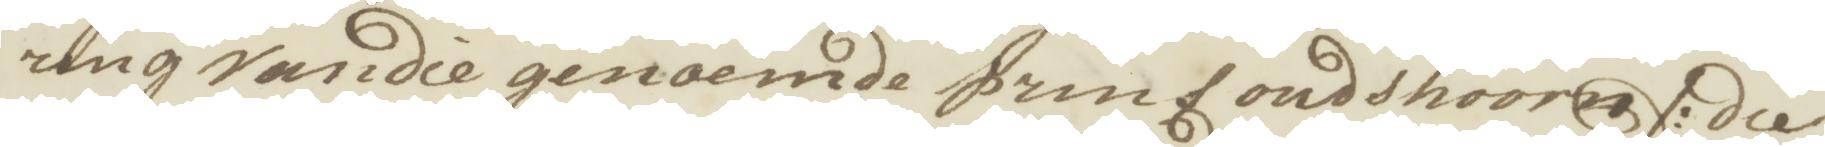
ring van die genoemde prins oudshooren /: die
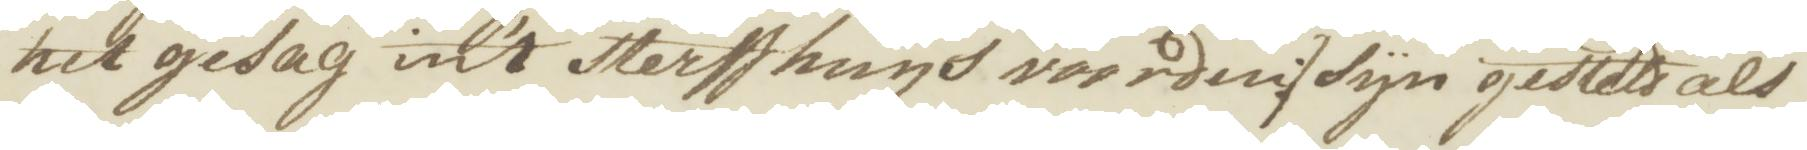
het gesag in’t sterffhuys voorden:/ sijn gesteld als
